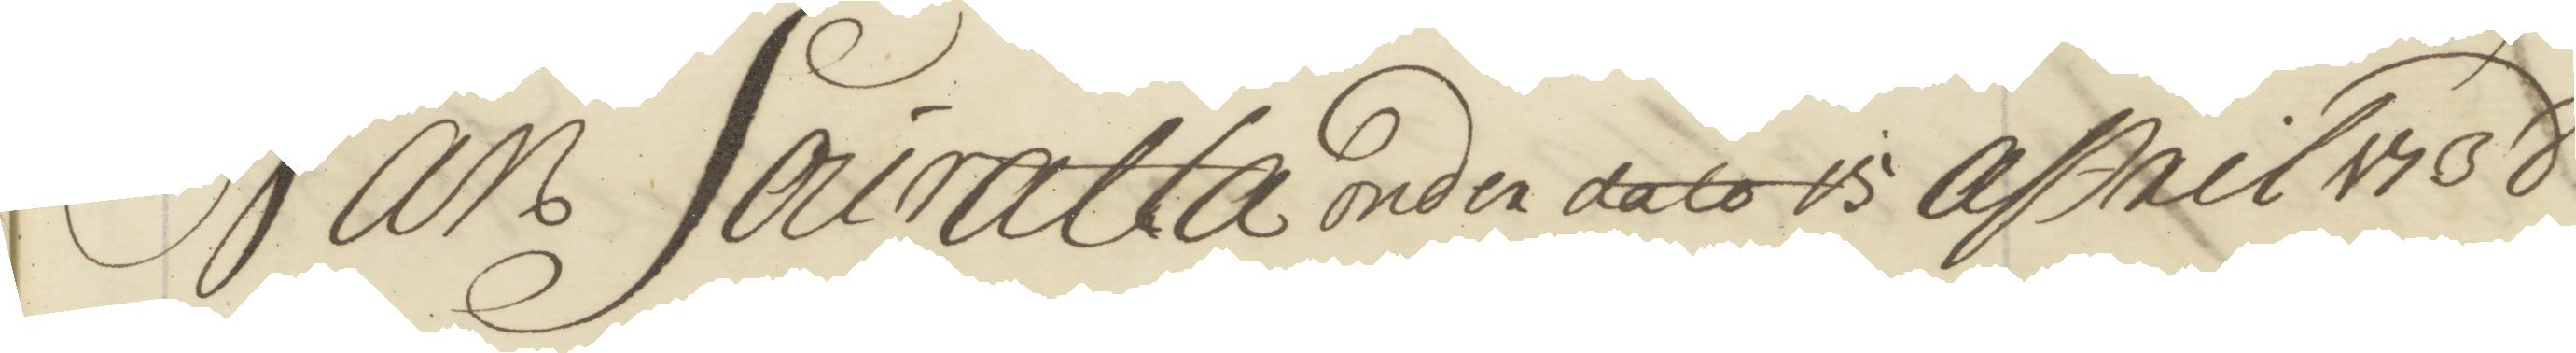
Van Souratta onder dato 15 april 1738
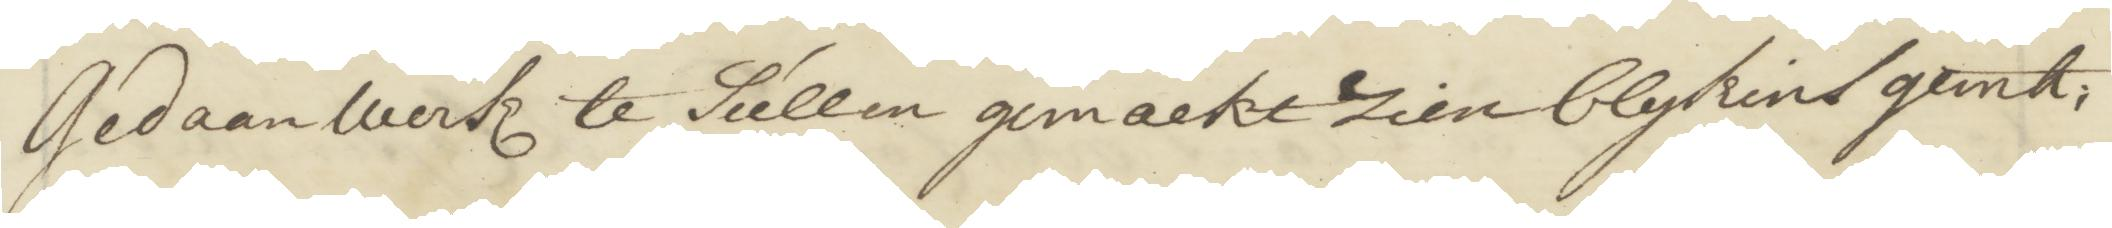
Gedaan Werk te sullen gemaekt zien blykins gemt;
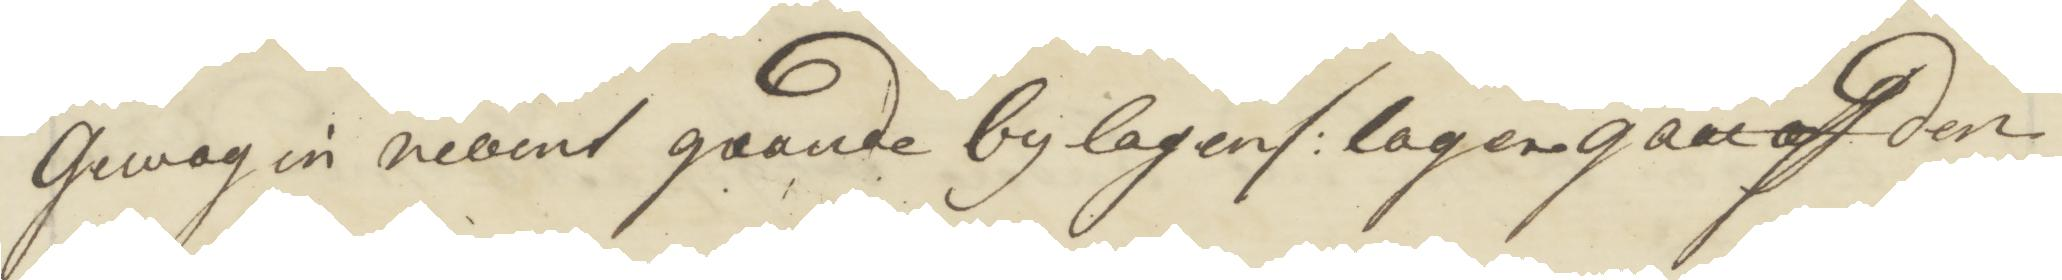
Gewag in nevens gaande by lagen (:lager gaet aff den
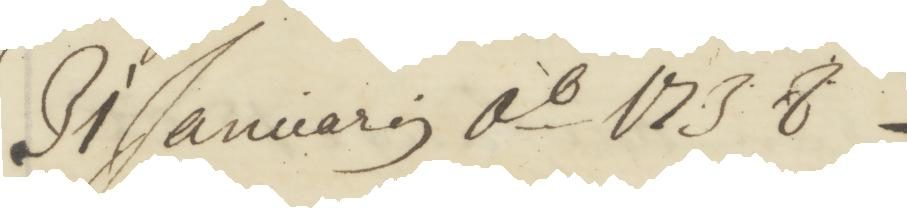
31 Januarij A—o 1738 —
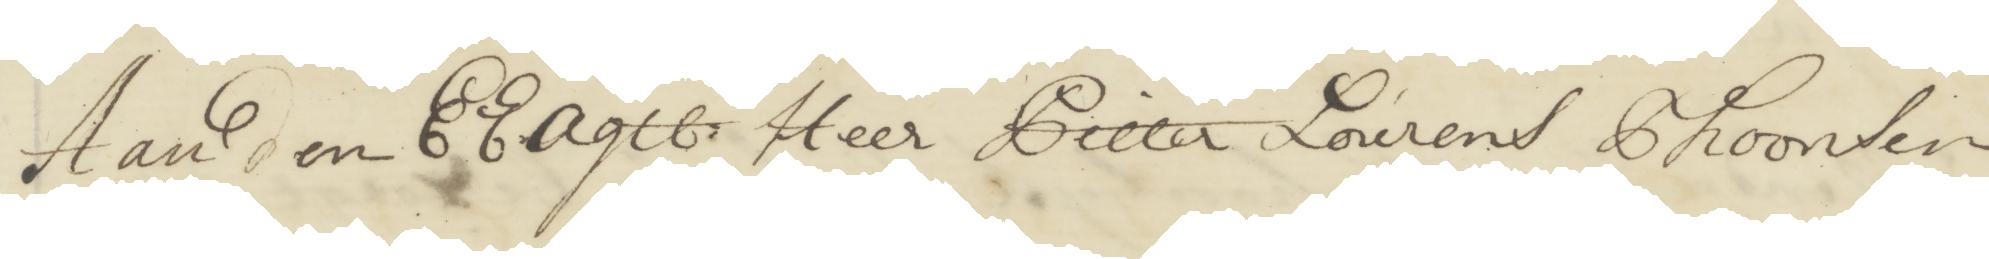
Aan den EE Agtb: Heer Pieter Lourens Thoonsen
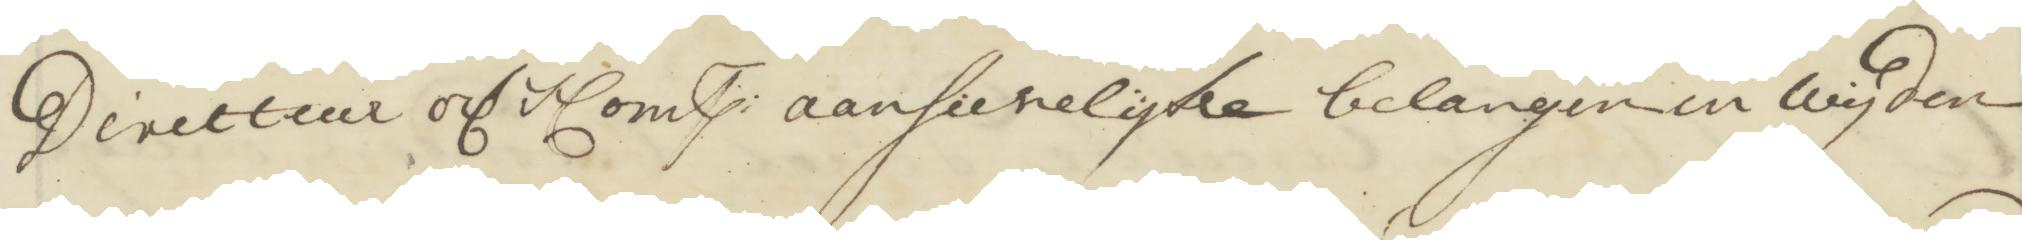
Directeur over sComp: aansienelijke belangen en wijden
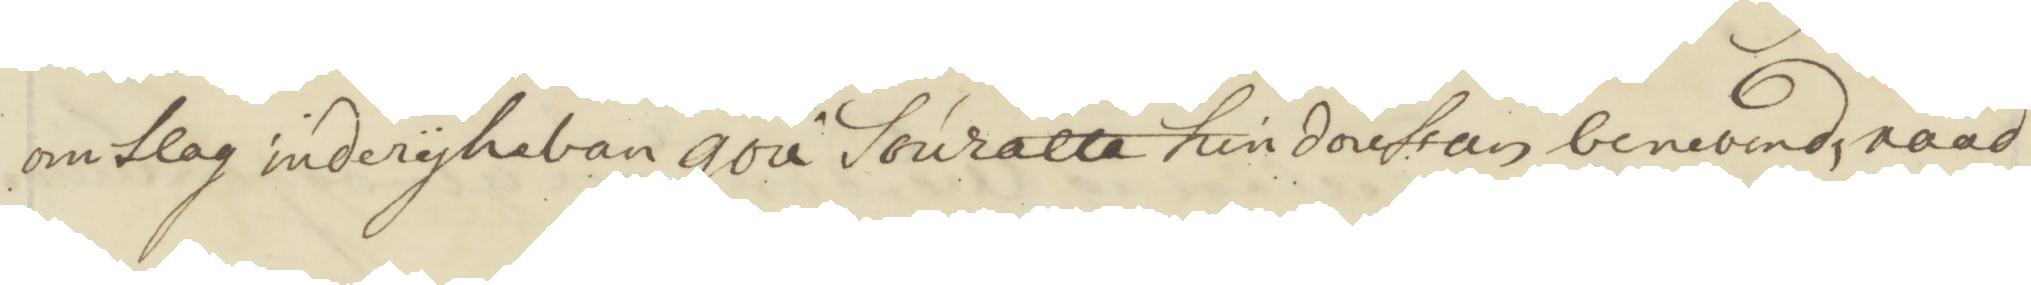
om slag inderijke Van gou souratta hin doustan benevend, raad
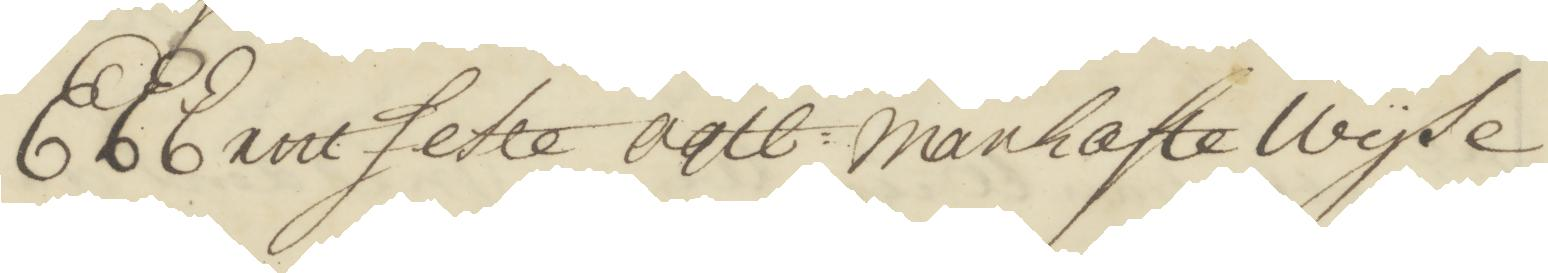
EE Erntfeste agtb: manhafte Wijse
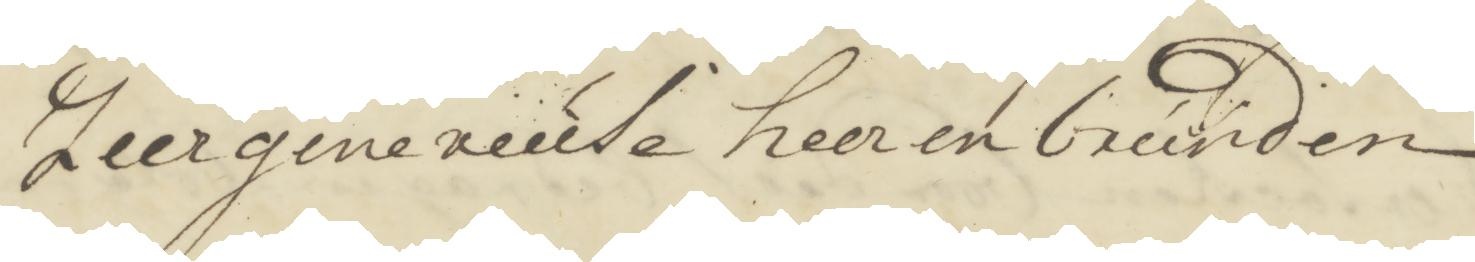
Zeer genereuse heer en Vrunden
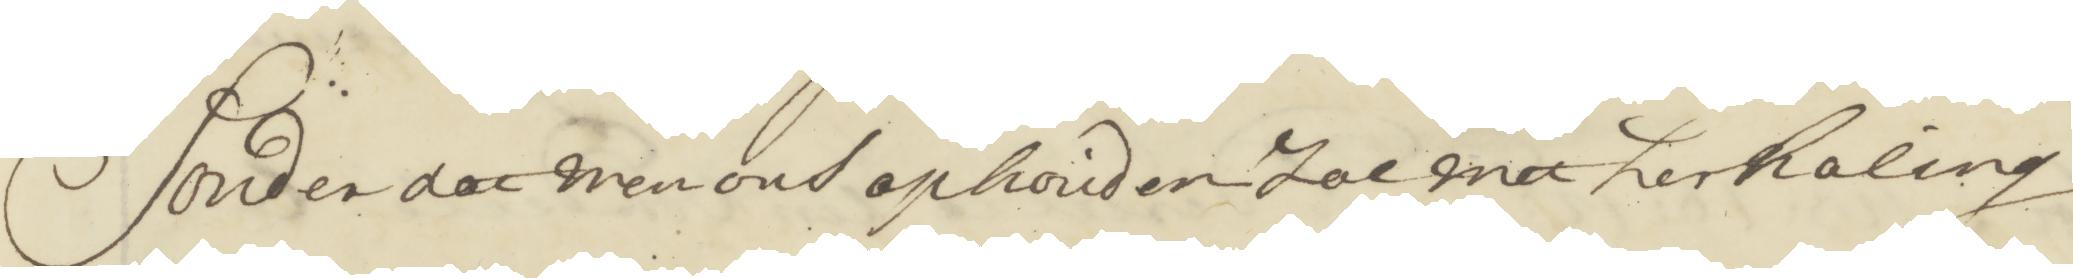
sonder dat men ons ophouden zal met herhaling
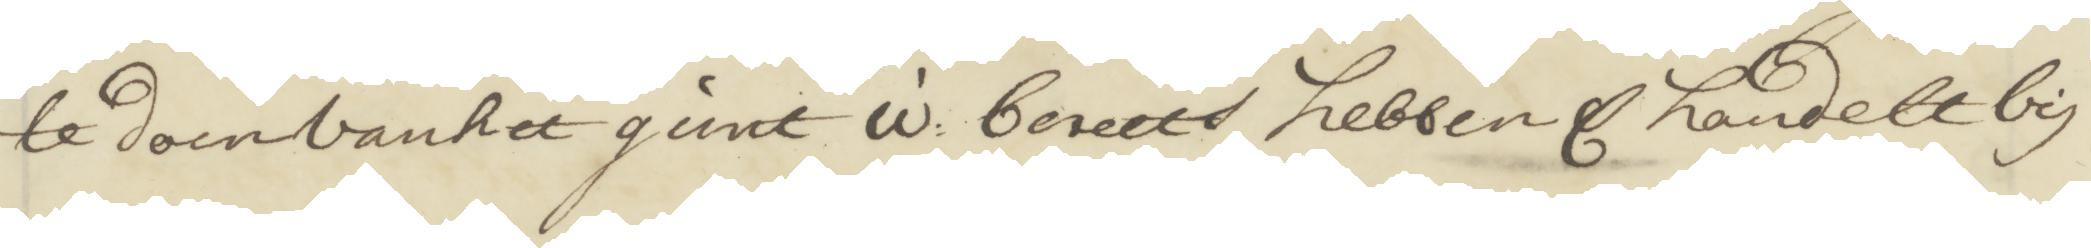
te doen Van het gunt w: bereets hebben ver handelt bij
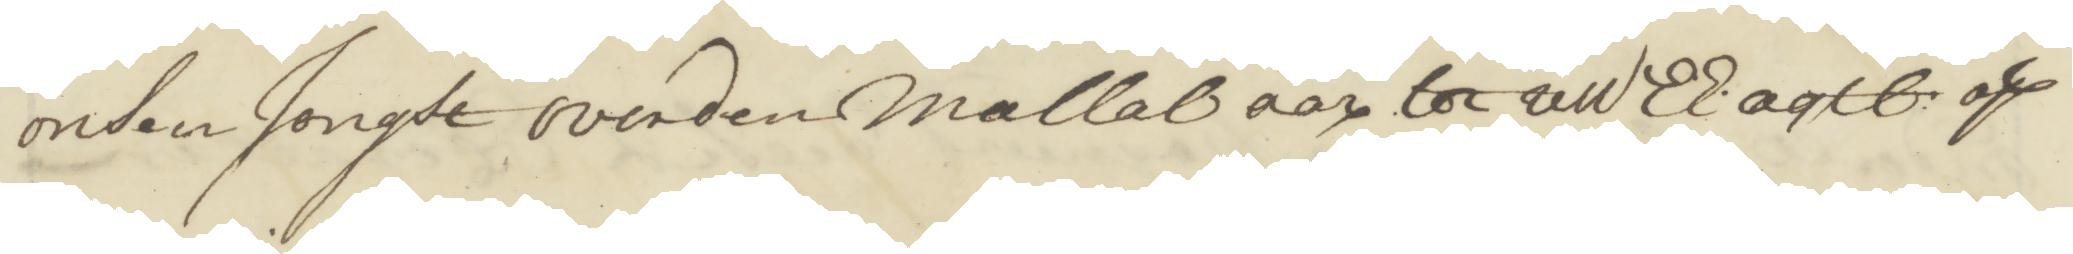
onsen Jongst overden Mallal aar tot uw EE. agtb: op
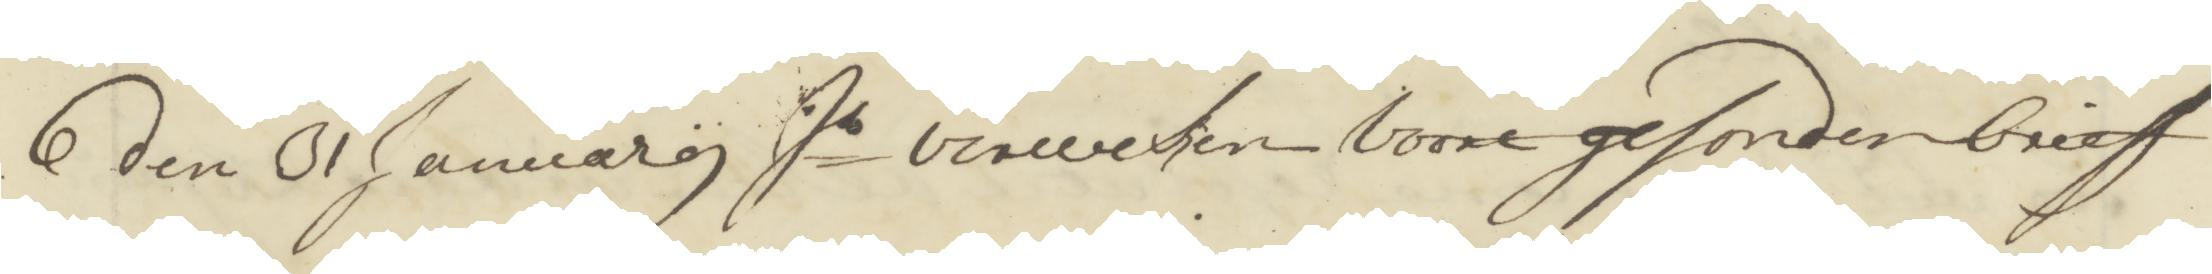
den 31 Januarij J=o verwesen voort gesonden brieff
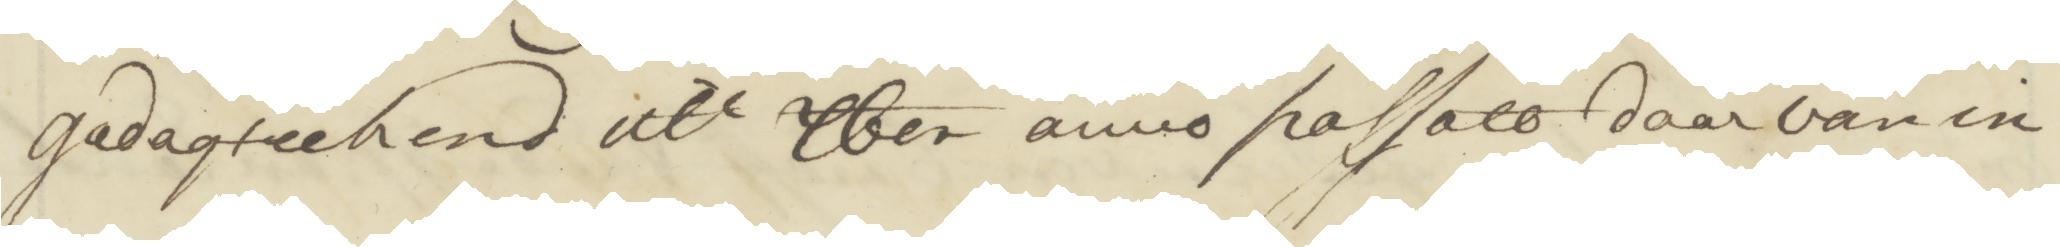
gedagteekend ult xber anno passato daar van in
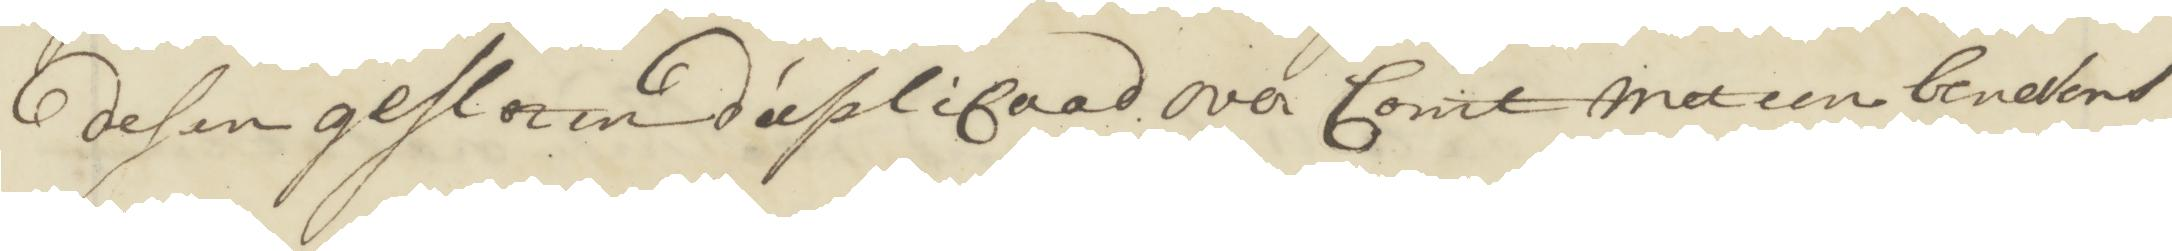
desen gesloten duplicaad over Comt met een benevens
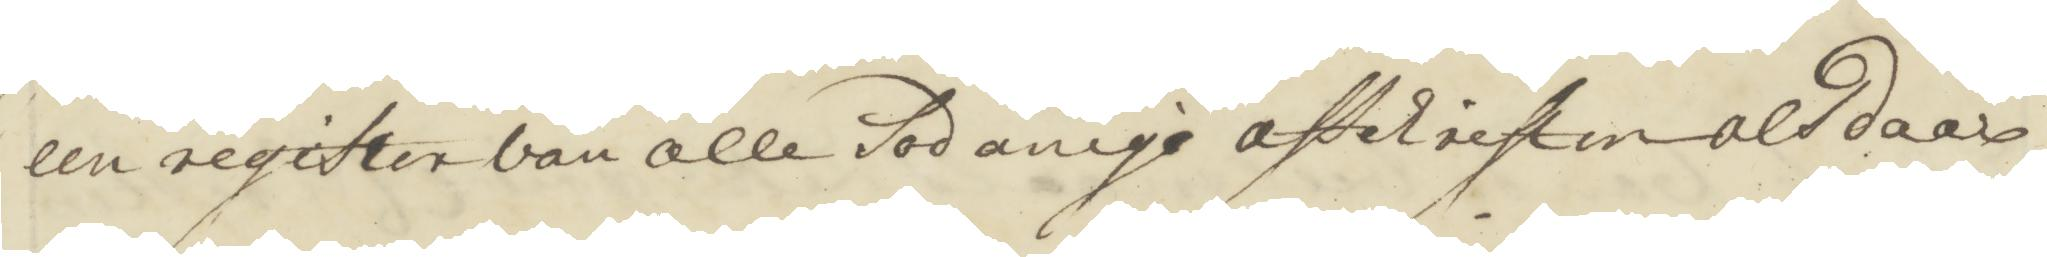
een register van alle sodanige afschriften als daar
